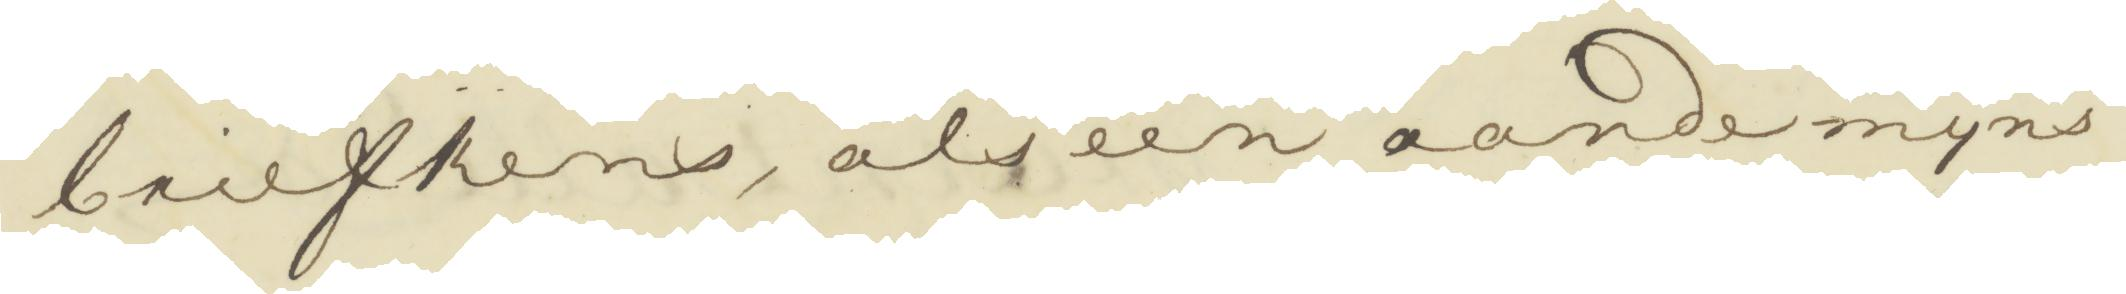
briefkens, als een aande mijns
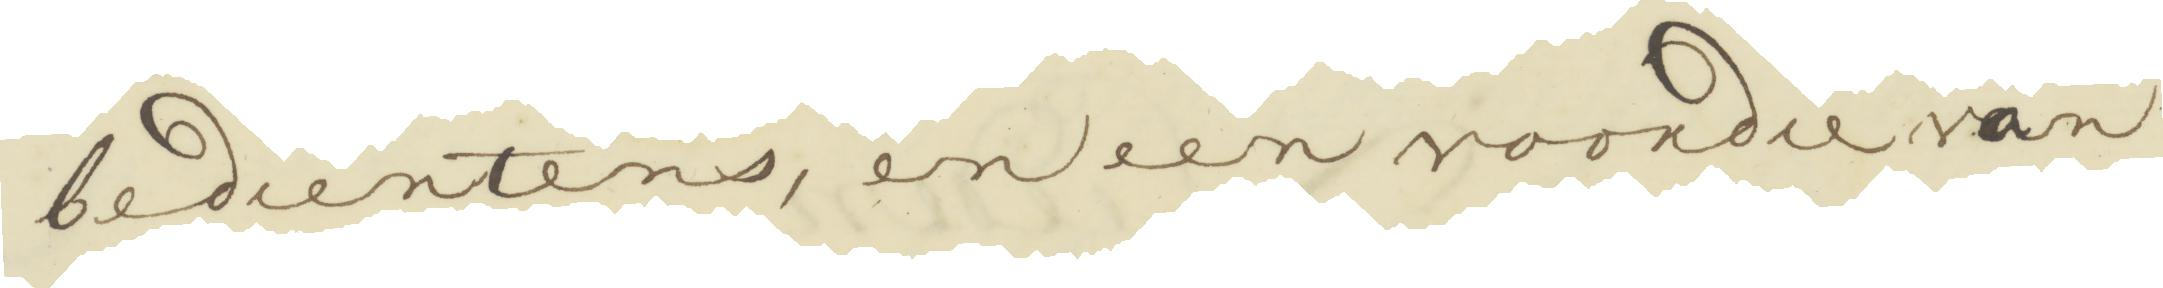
bedientens, en een voor die van
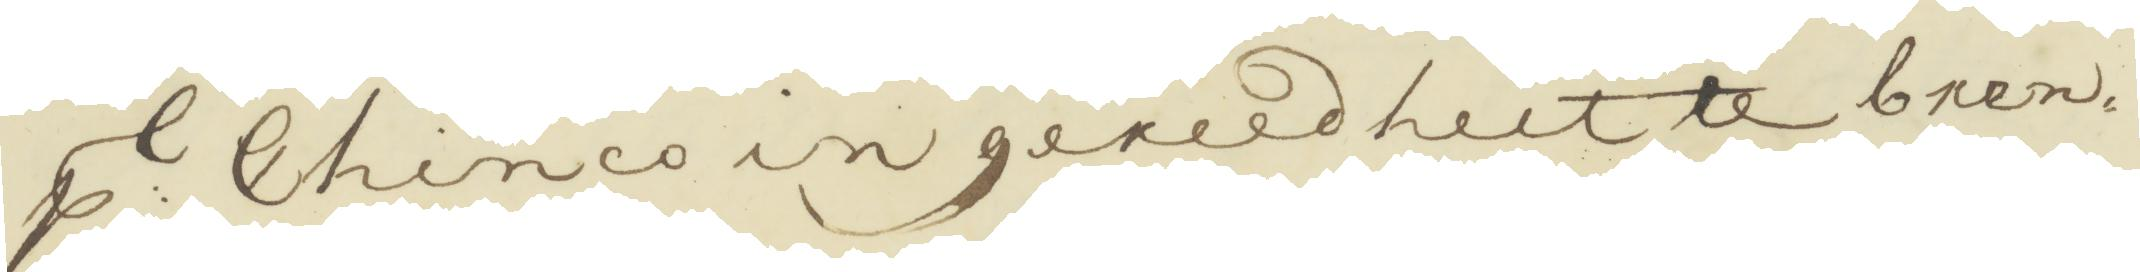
p:l Chinco in gereedheit te bren„
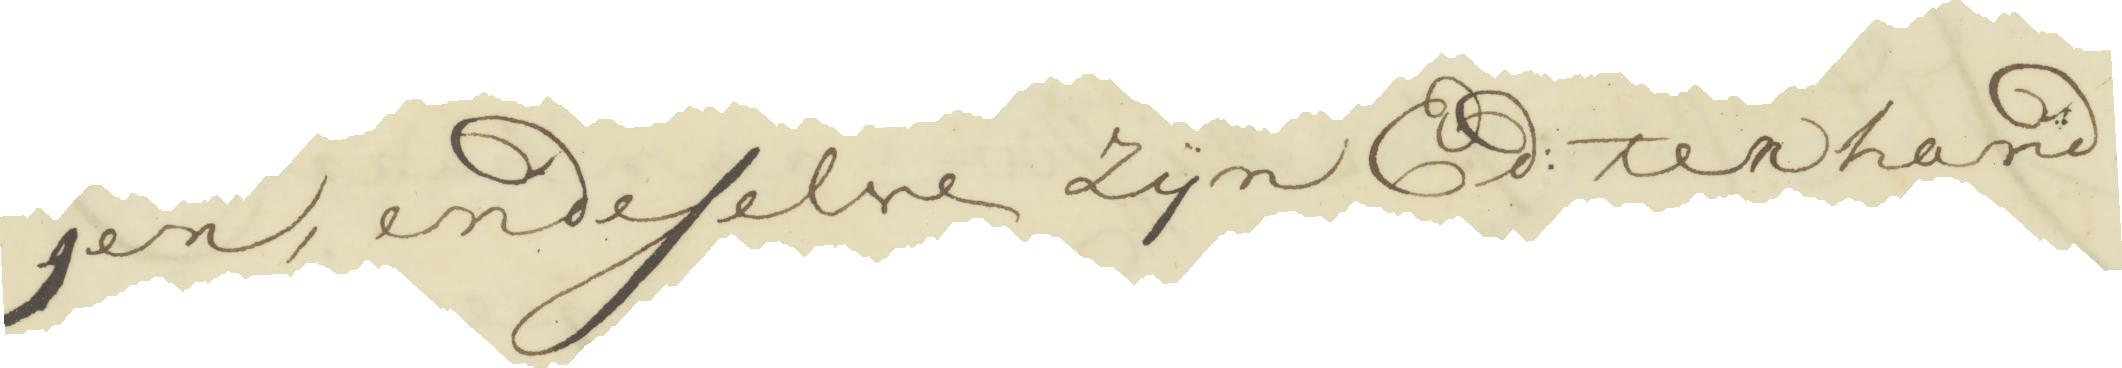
gen, en deselve zijn Ed: ter hand
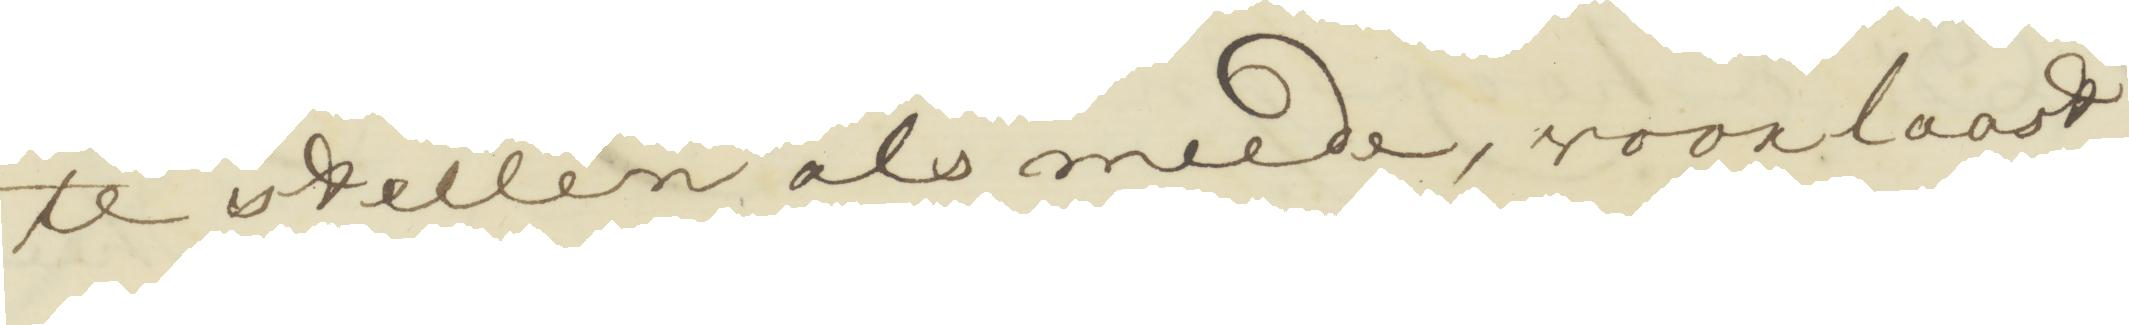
te stellen als meede, voor laast
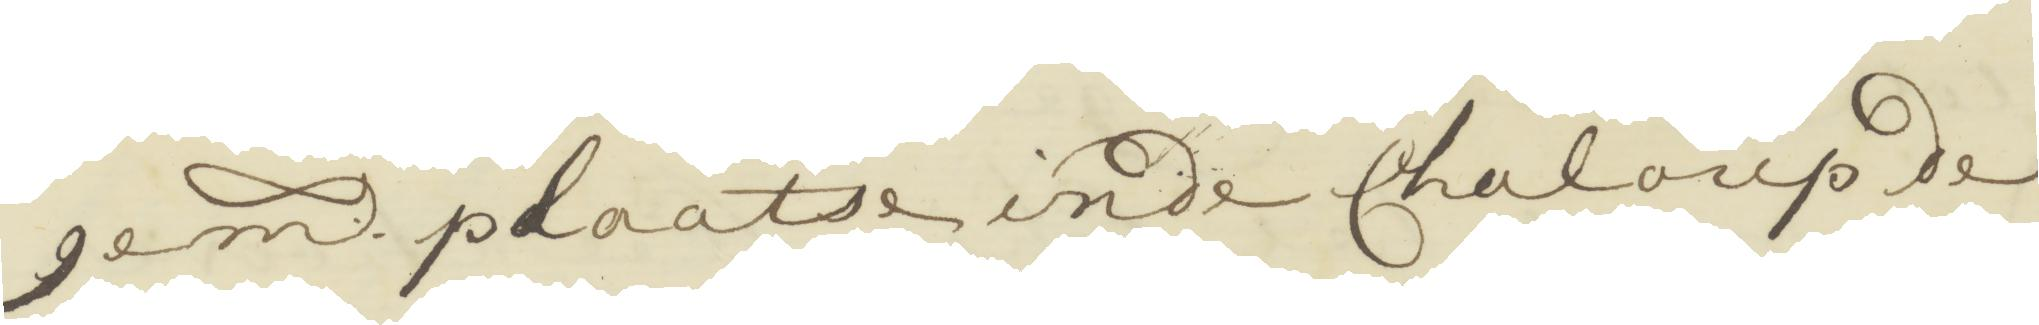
gem: plaatse in de Chaloup de
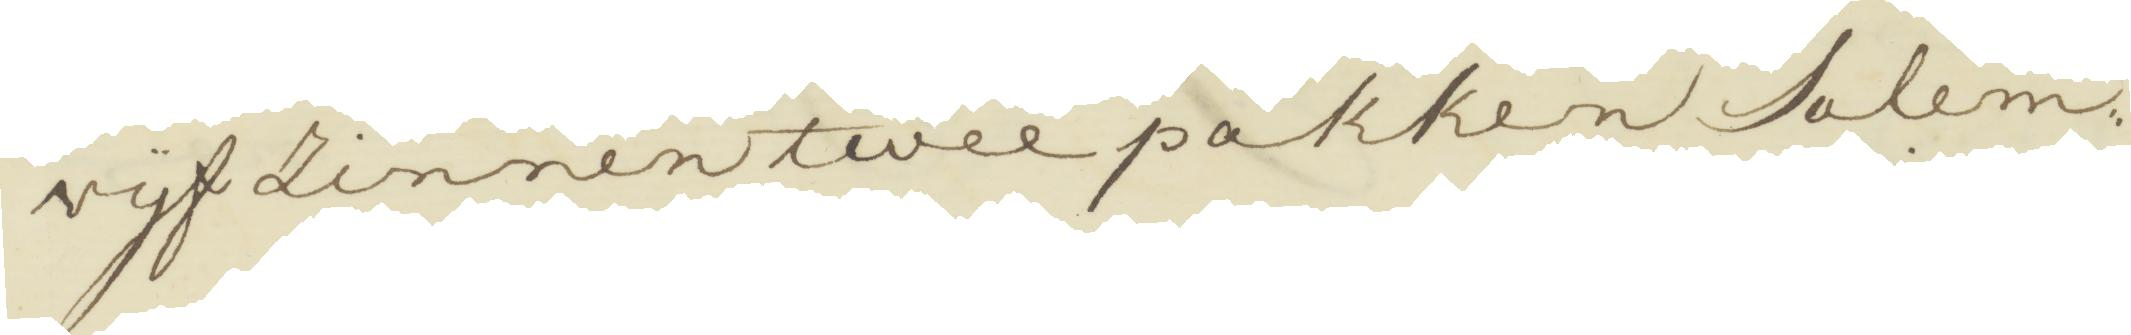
vijf zinnen twee pakken salem„
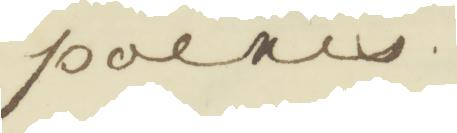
poeris.
